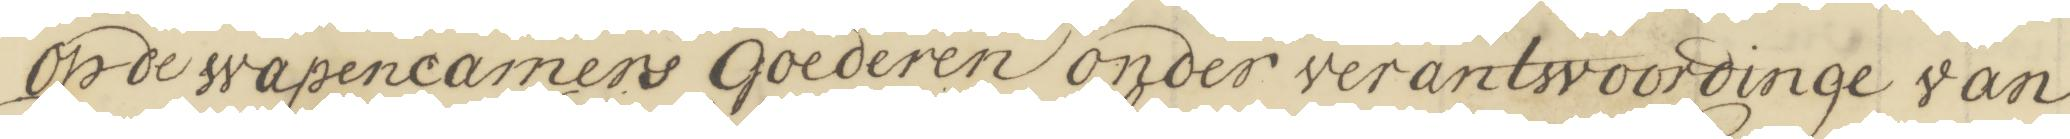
op de wapencamers goederen onder verantwoordinge van
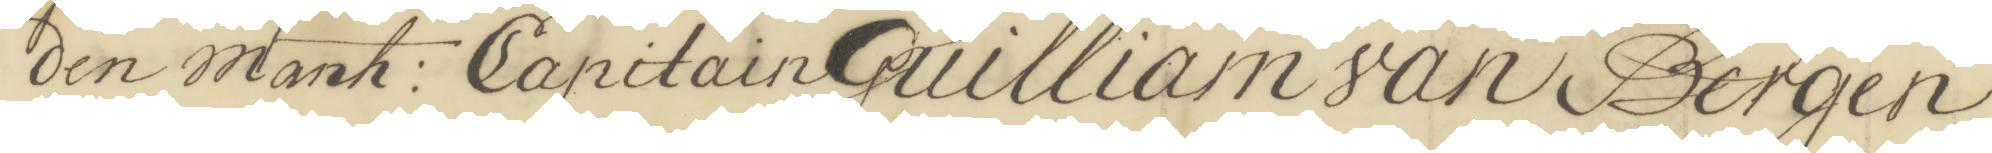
den manh: Capitain Guilliam van Bergen
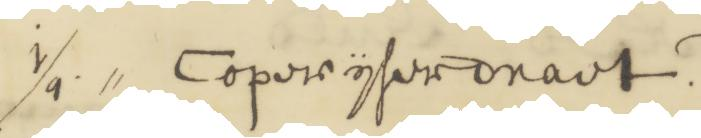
¼. „ Coper ijserdraet
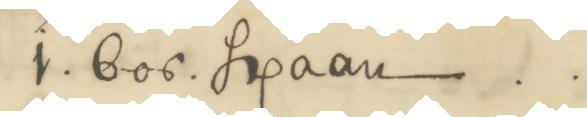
1. bos. spaan .
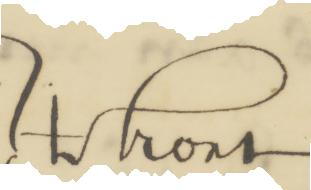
te kort
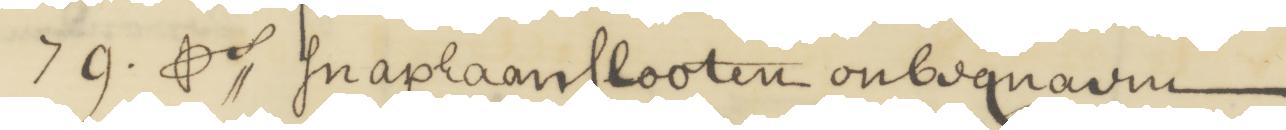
79. p„s snaphaanslooten onbequaem
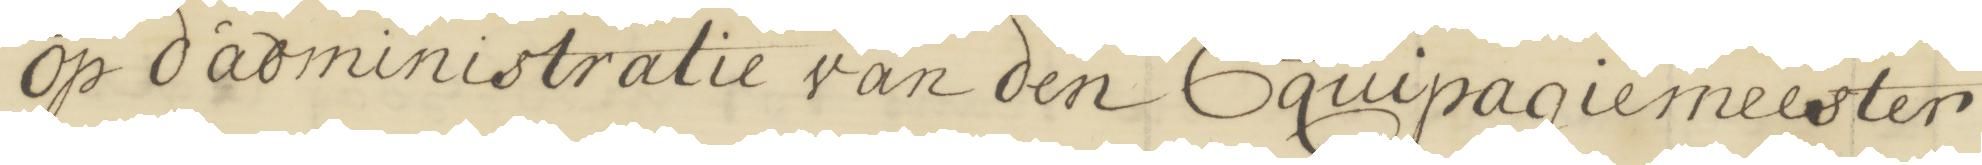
op d’administratie van den Equipagiemeester
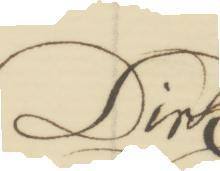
Dirk
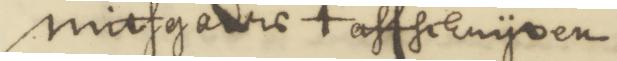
mitsgaders ’t affschrijven
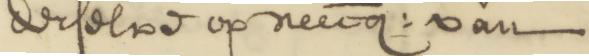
derselve op reecq: van
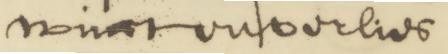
winst en verlies
